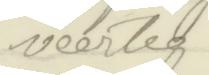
veerteg
